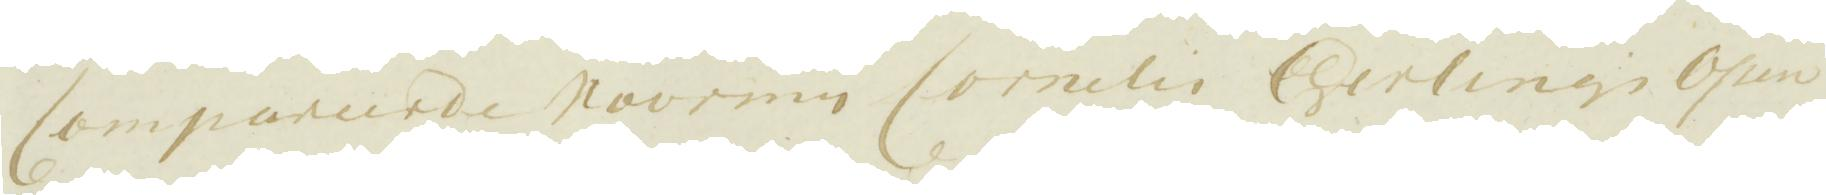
Compareerde voormij Cornelis Gerlings Open
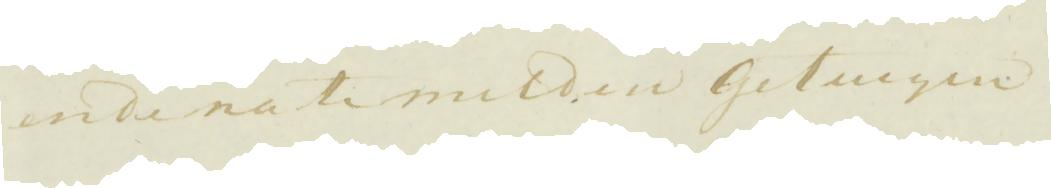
ende na te melden getuigen
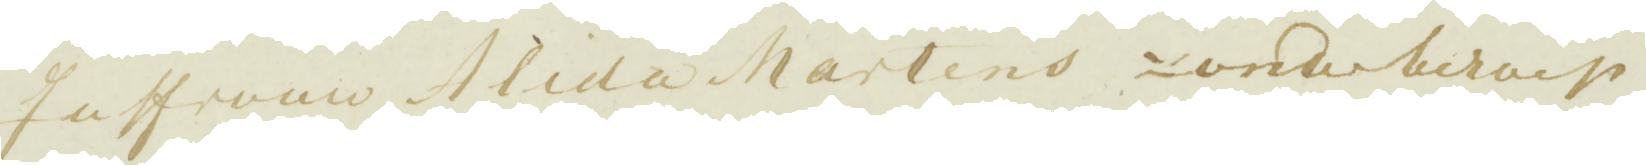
Juffrouw Alida Martens zonder beroep
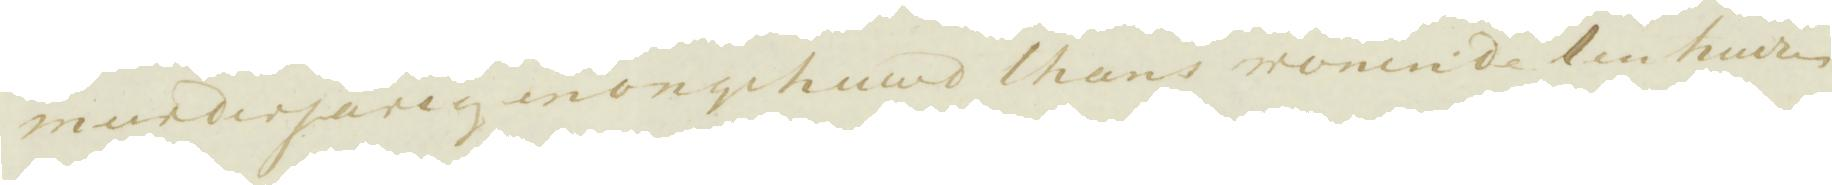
meerderjarig en ongehuwd thans wonende ten huizen
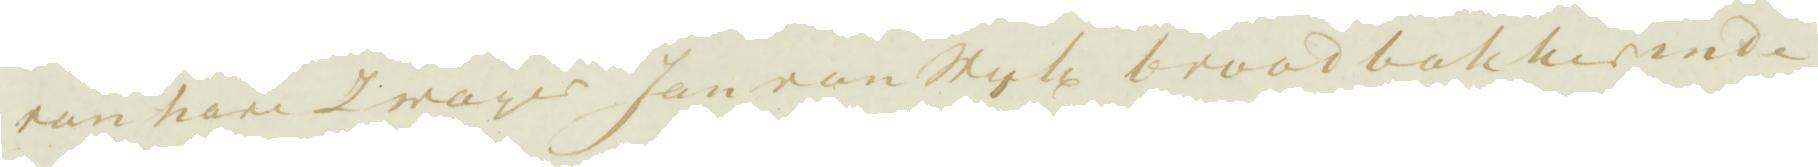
van hare Zwager Jan van Wyk broodbakker inde
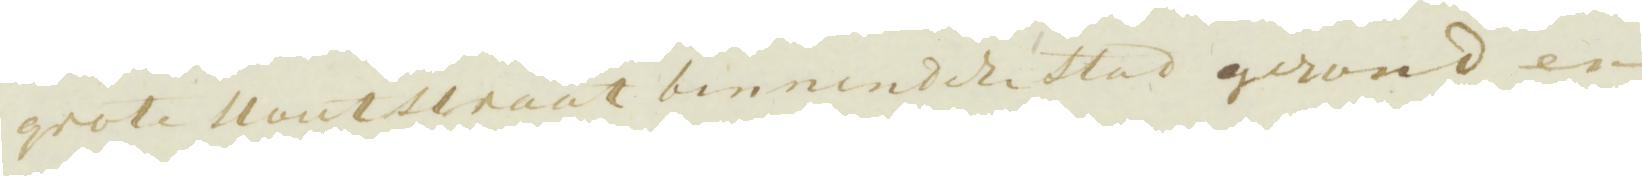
grote Houtstraat binnen deze stad gezond en
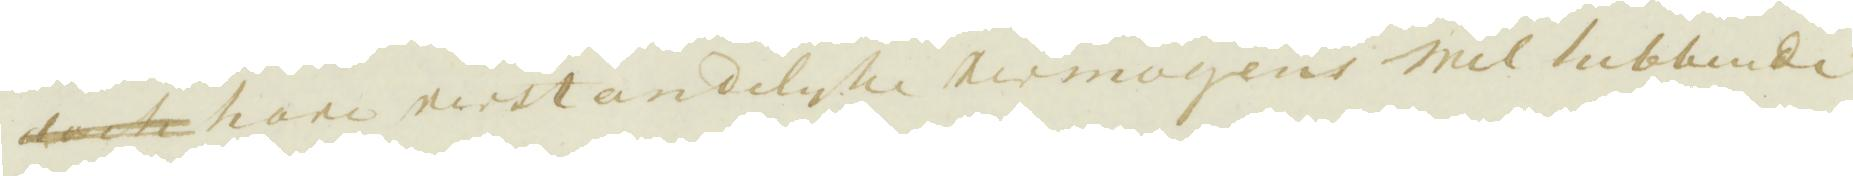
doch hare verstandelyke vermogens wel hebbende
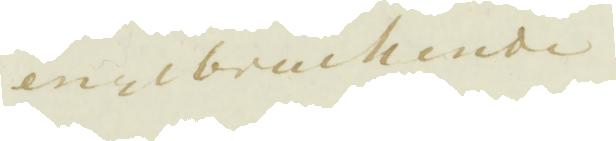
en gebruikende
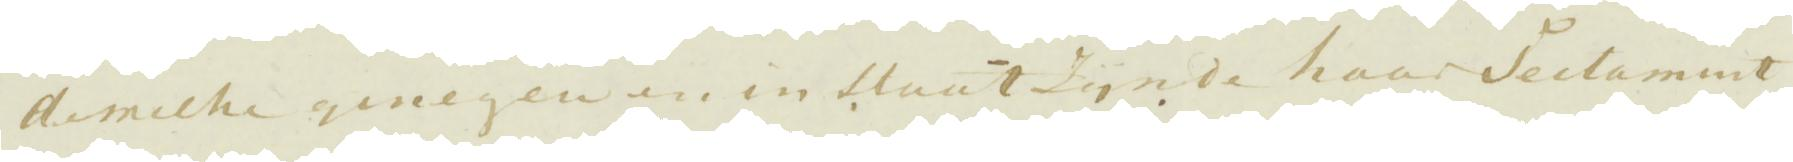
dewelke genegen en in staat zijnde haar Testament
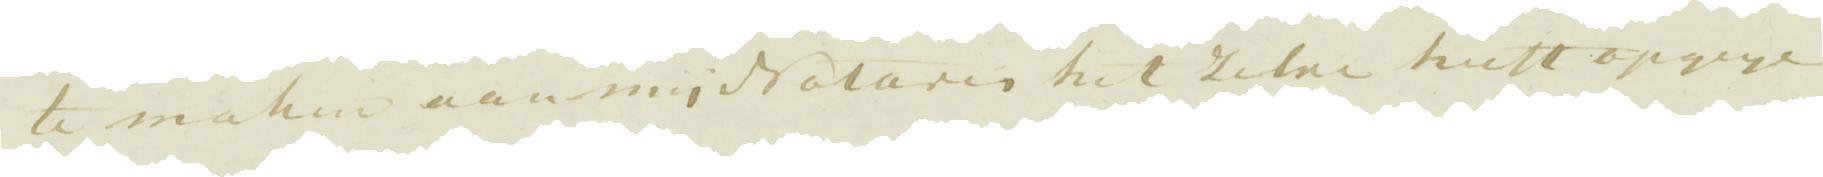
te maken aan my Notaris het zelve heeft opgege
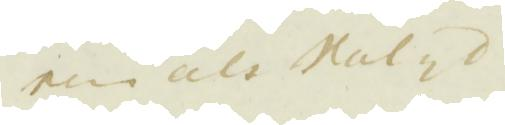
ven als volgd
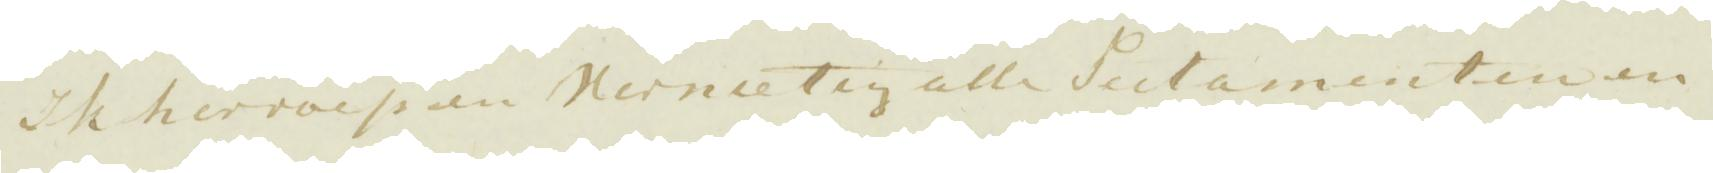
Ik herroep en Vernietig alle Testamenten en
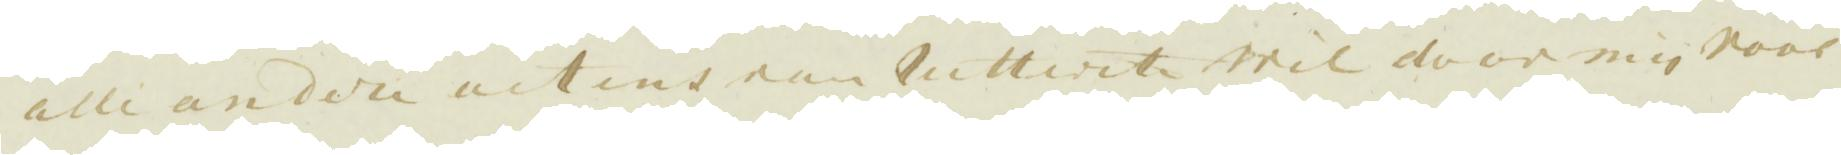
alle andere actens van Uitterte wil door mij voor
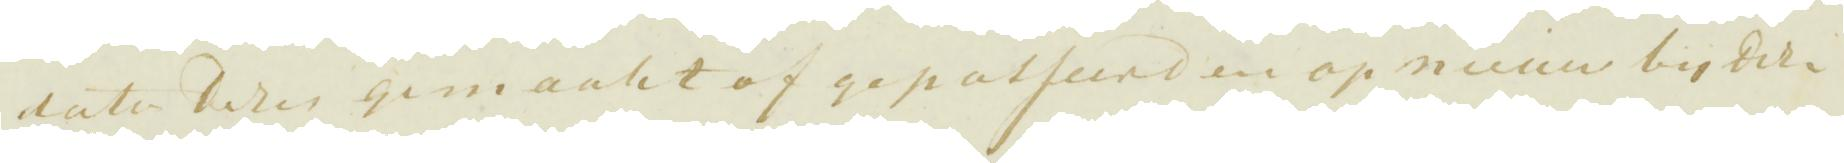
dato dezes gemaakt of gepasseerd en op nieuw bij deze
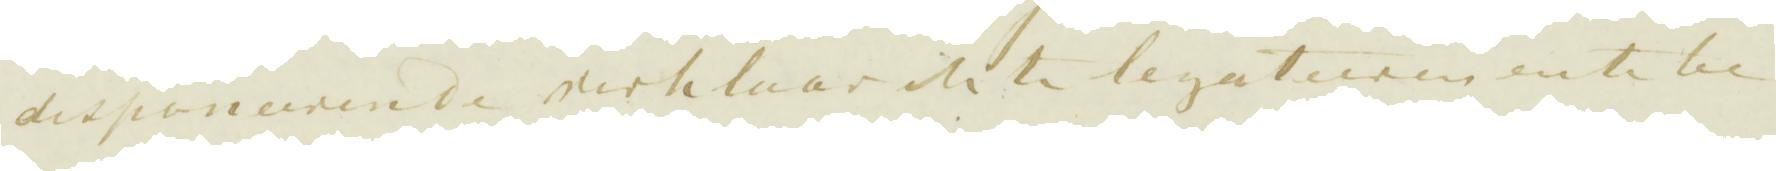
disponeerende verklaar ik te legateeren en te be
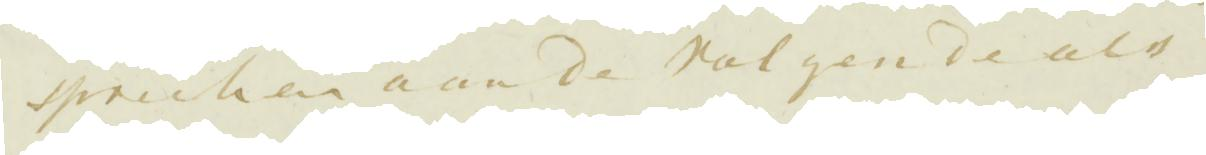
spreeken aan de volgende als
